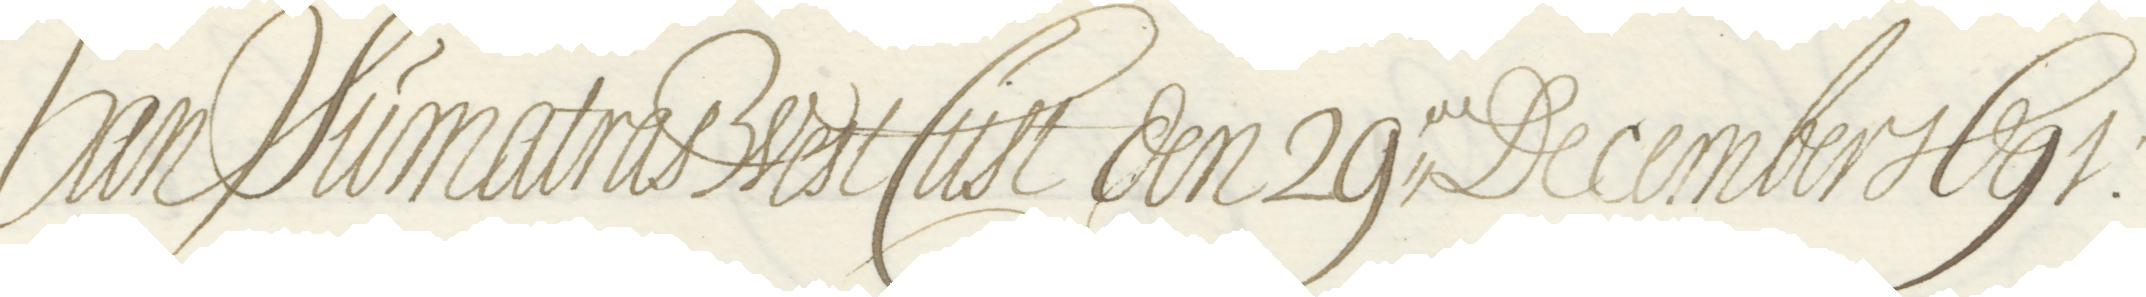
Van Sumatras West Cust den 29„en December 1691:
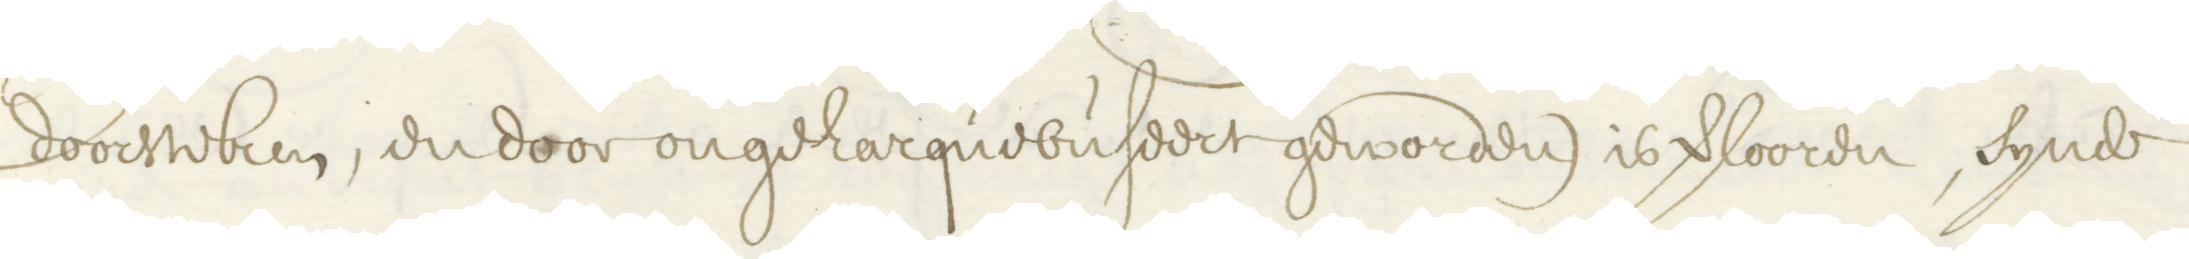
doorsteken, en door ongeharquebuseert geworden) is verlooren, sijnde
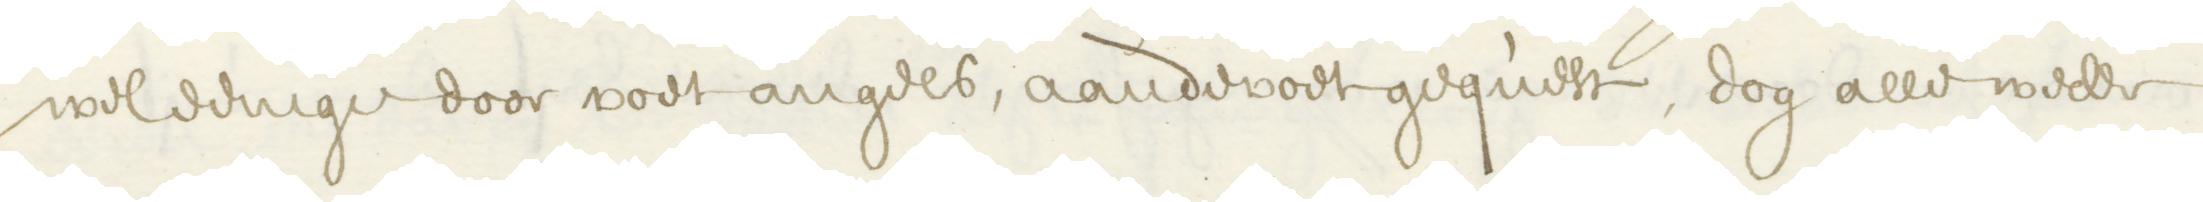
wel eenige door voet angels, aan devoet gequest, dog alle weder
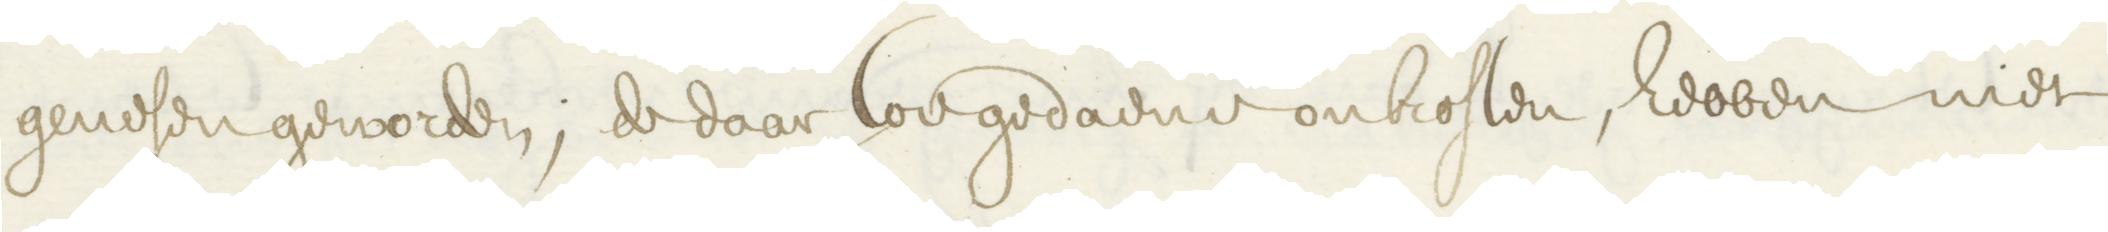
genesen geworden; de daar toegedaene onkosten, hebben niet
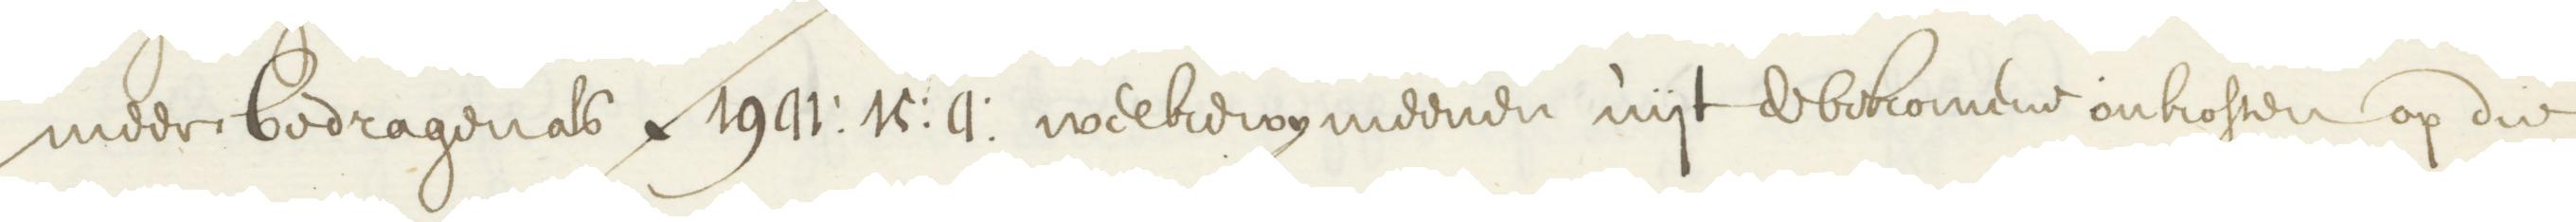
meer bedragen als ƒ1941:15:4: welke wy meenen uijt de bekomene onkosten op die
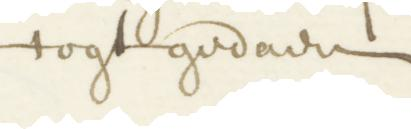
togt gedaen
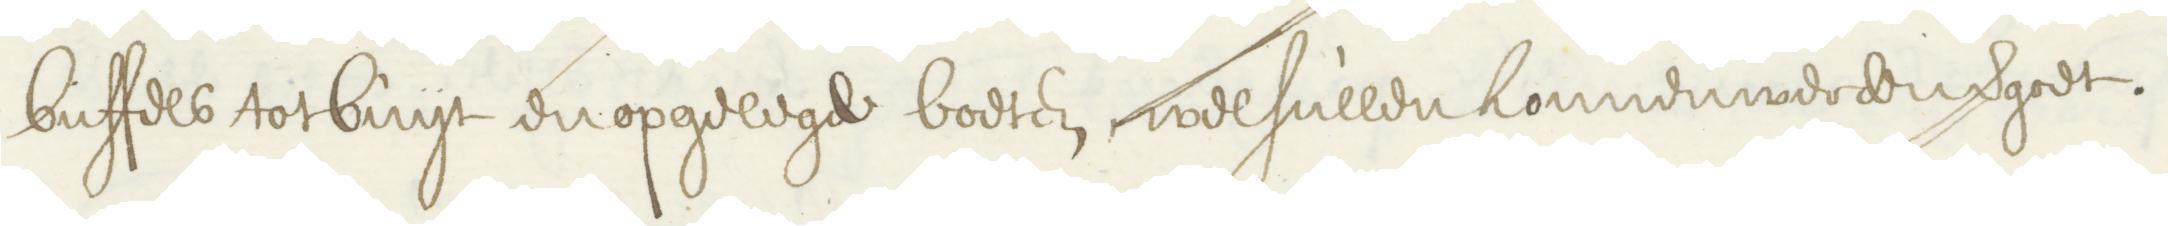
buffels tot buijt en opgelegde boeten, wel sullen konnen werden vergoet.
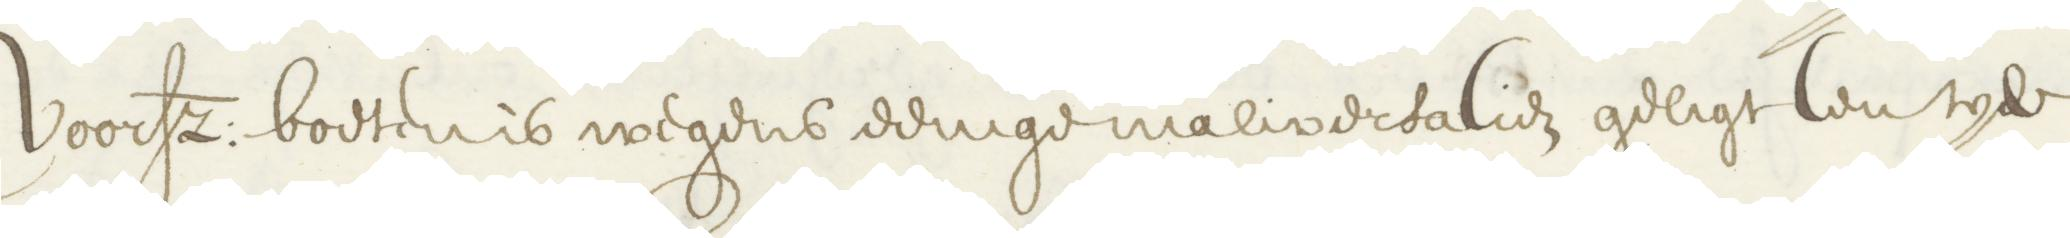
voorsz: boetenis wegens eenige maliversatien geligt ten tyde
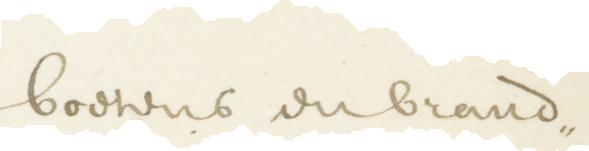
boetens en brand„
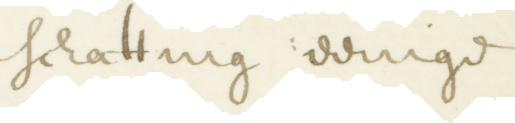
schatting eenige
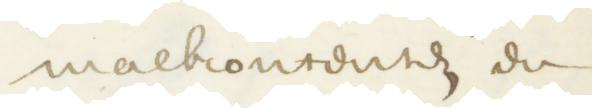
malkontenten en
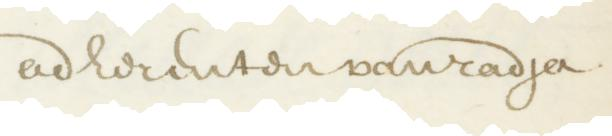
adherenten van radja
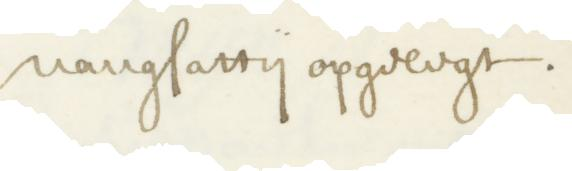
nangsattij opgelegt.
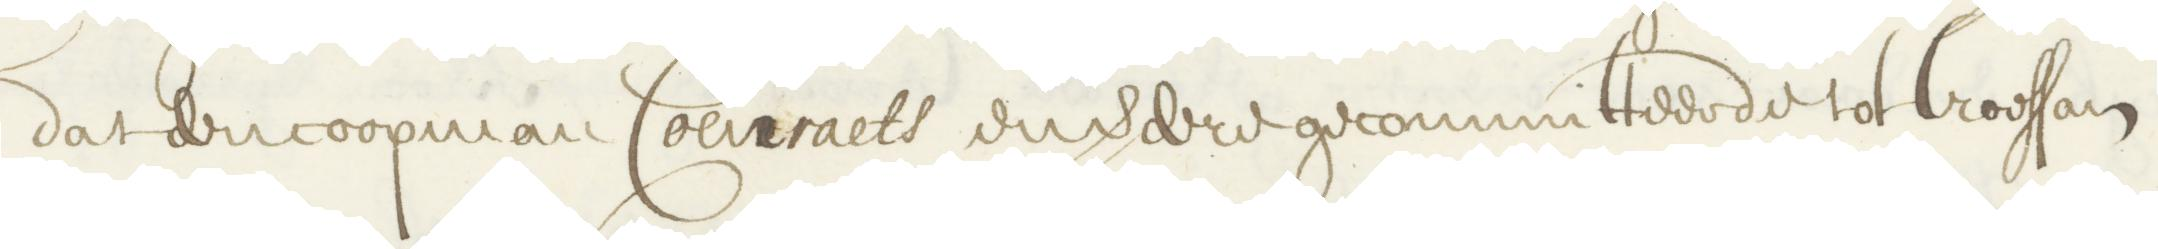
dat den coopman Coenraets en verdere gecommitteerde tot troessan
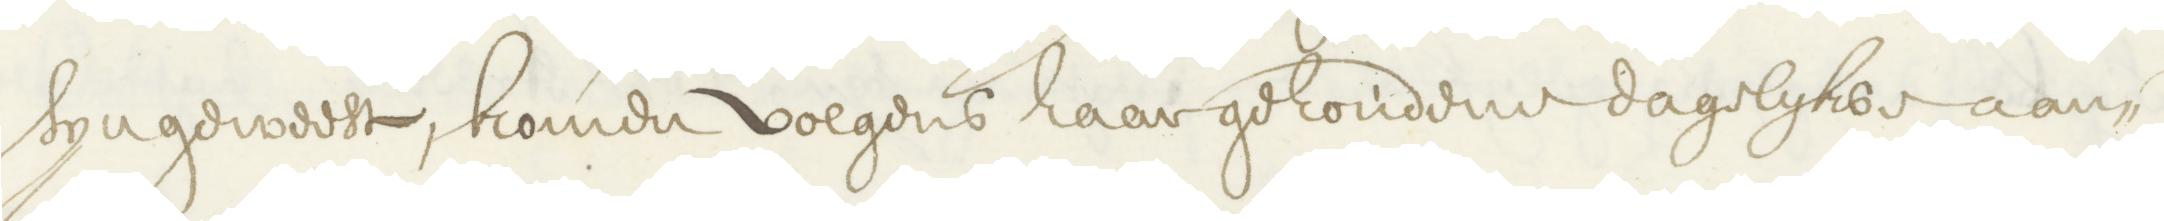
syn geweest, komen volgens haar gehoudene dagelijkse aan„
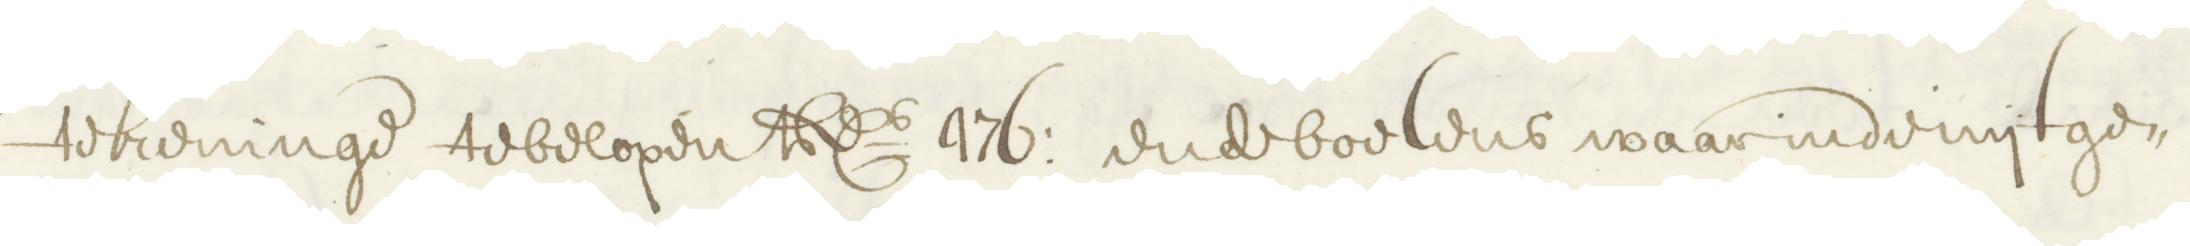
tekeninge tebelopen RX=s 476: ende boetens waar in de uijtge„
